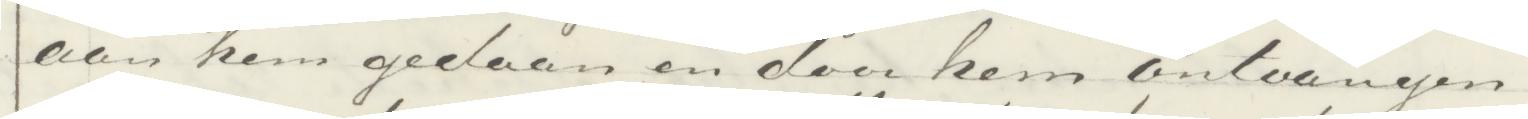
aan hem gedaan en door hem ontvangen
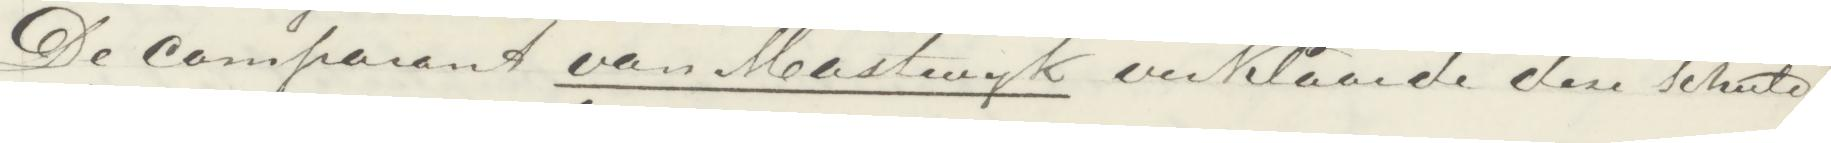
De Comparant van Mastwyk verklaarde deze schuld
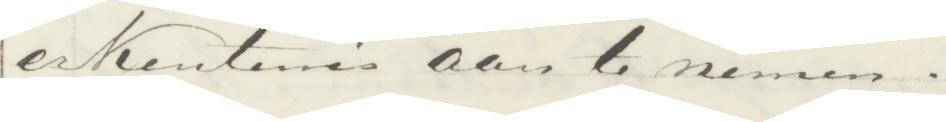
erkentenis aan te nemen.
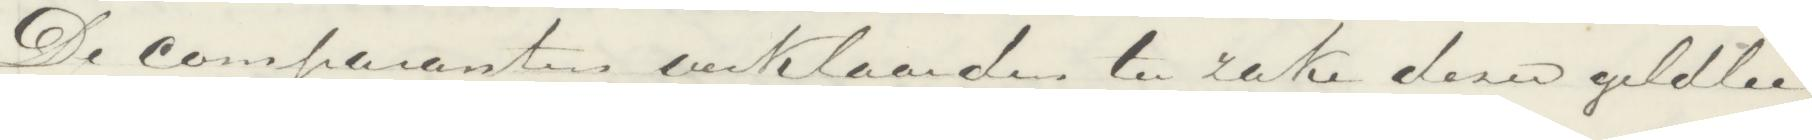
De comparanten verklaarden ter zake dezer geldlee
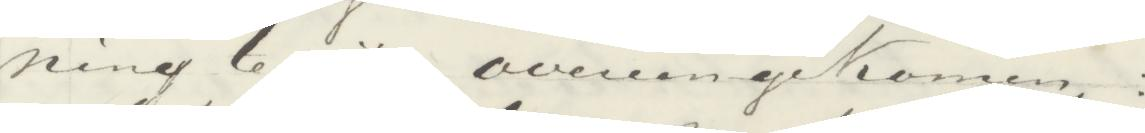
ning te zijn overeengekomen.
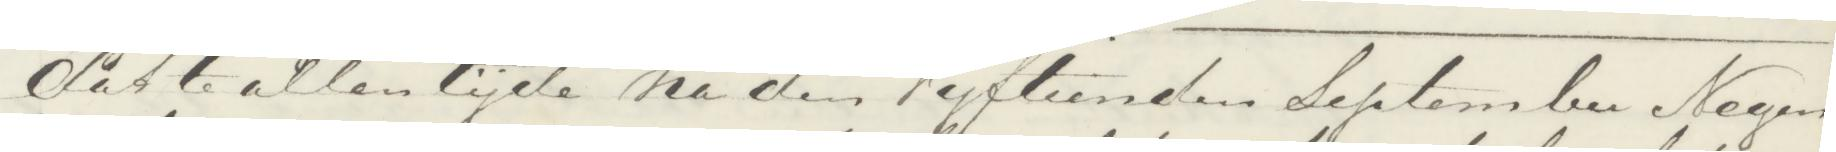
dat te allen tijde na den Vijftienden September Negen
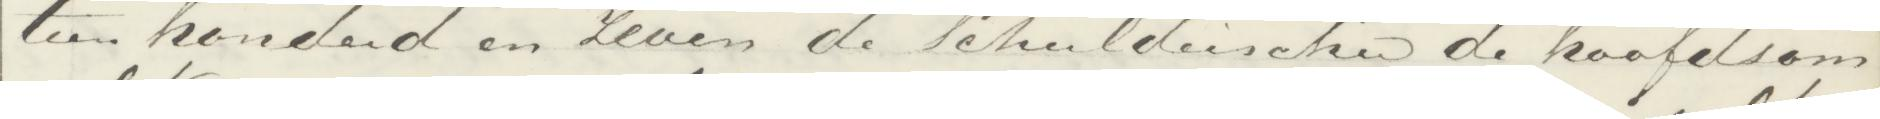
tien honderd en zeven de schuldeischer de hoofdsom
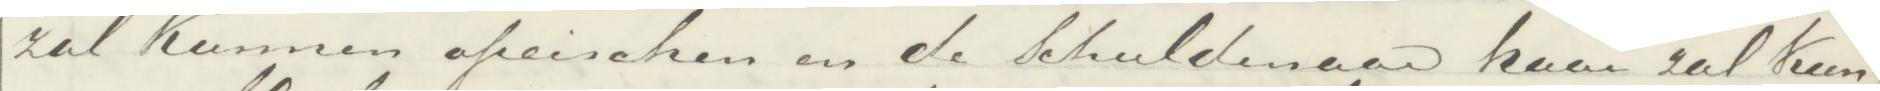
zal kunnen opeischen en de schuldenaar haar zal kun
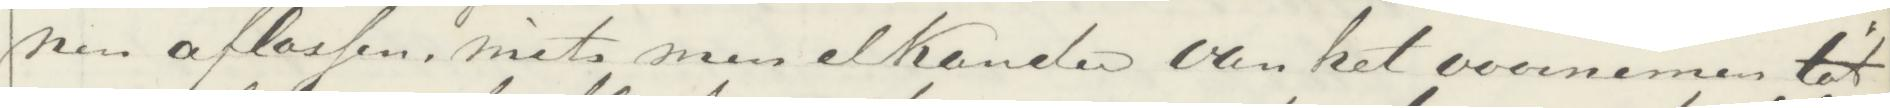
nen aflossen, mits men elkander van het voornemen tot
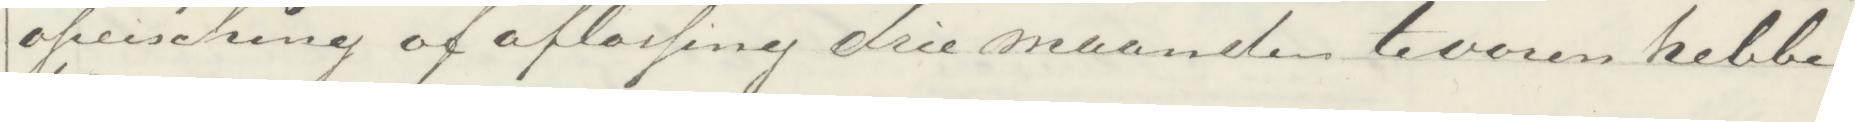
opeisching of aflossing drie maanden te voren hebbe
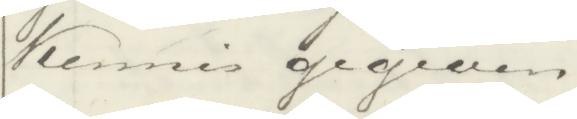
kennis gegeven
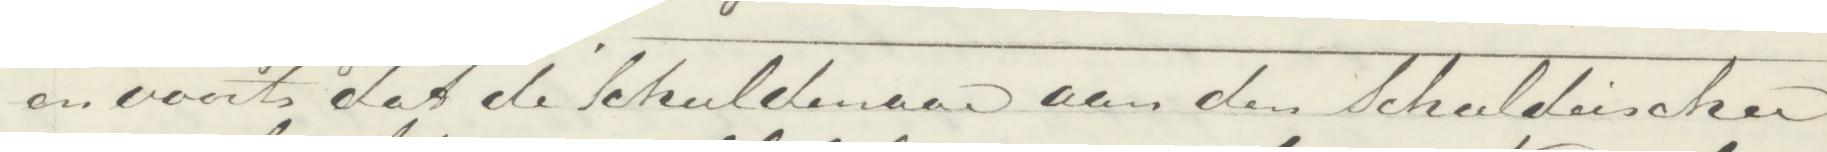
en voorts dat de schuldenaar aan den schuldeischer
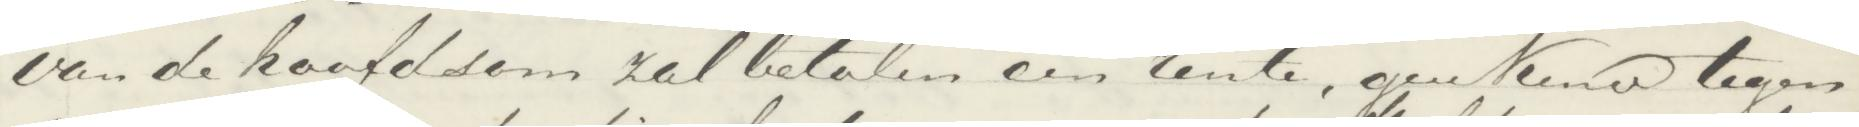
van de hoofdsom zal betalen een rente, gerekend tegen
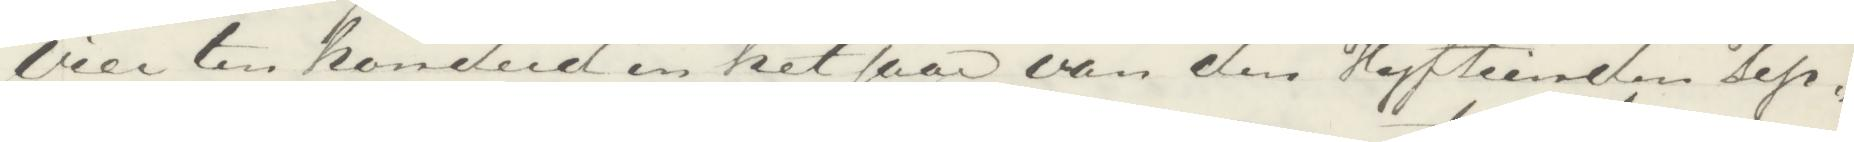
vier ten honderd in het jaar van den Vyftienden sep„
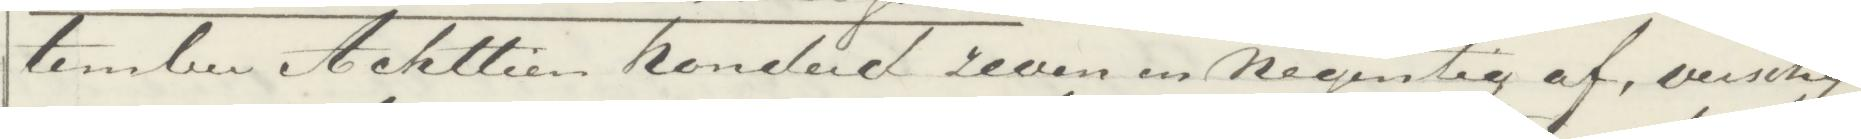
tember Achttien honderd zeven en negentig af, verschij
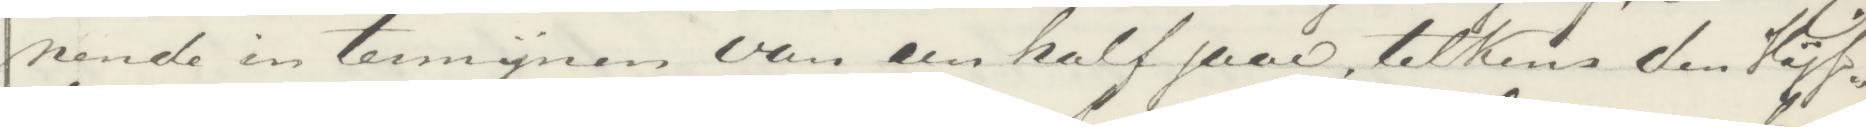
nende in termijnen van een half jaar, telkens den Vijf„
